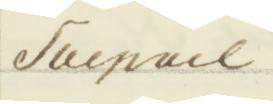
Toepoel
